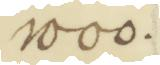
1000.
